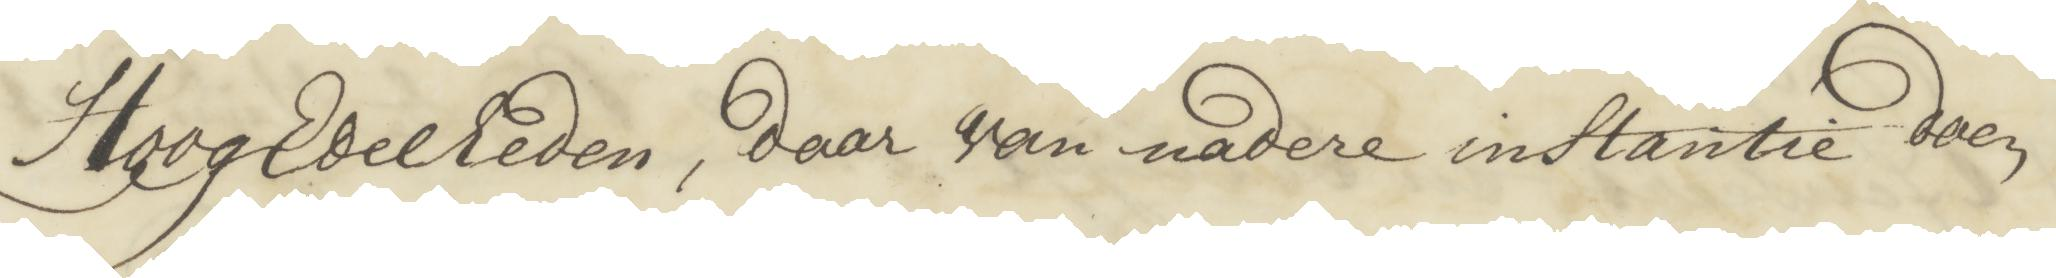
Hoog Edelheden, daar van nadere instantie doen
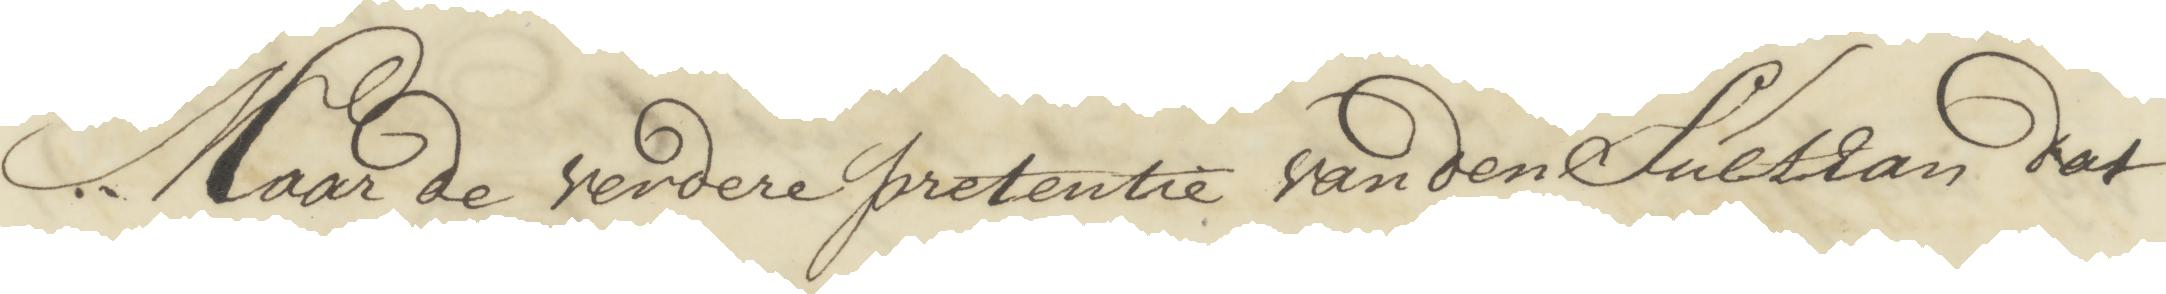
Maar de verdere pretentie van den sulthan dat
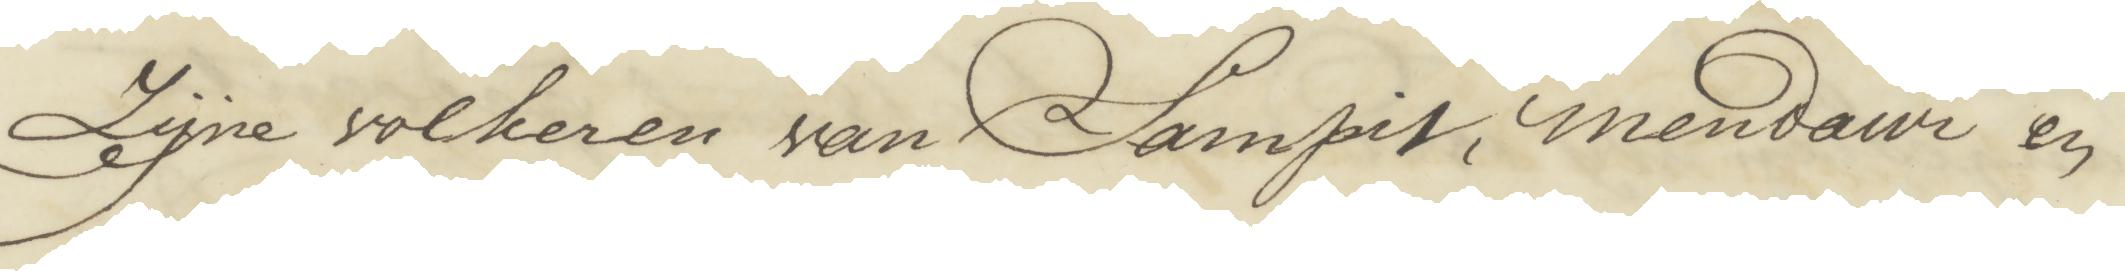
zijne volkeren van Sampit, mendawi en
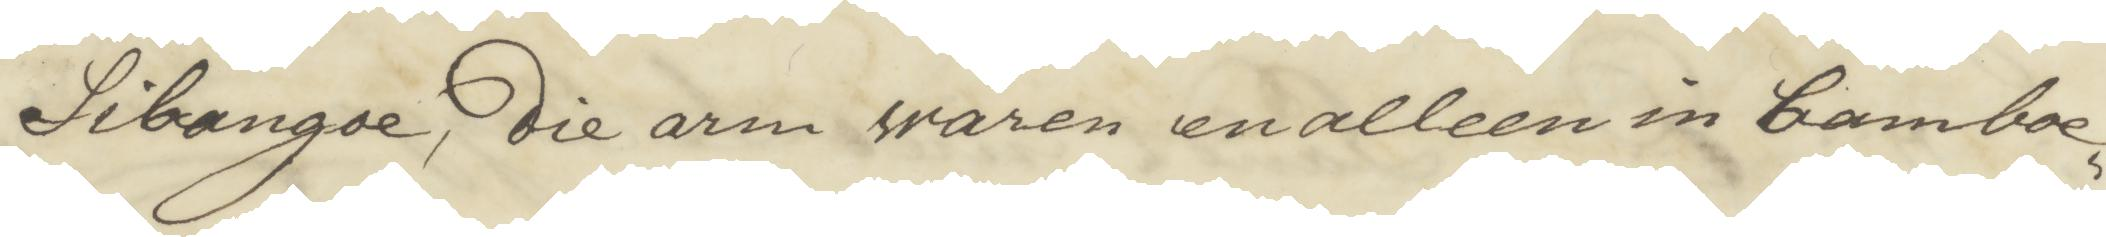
sibangoe, die arm waren en alleen in bamboe„
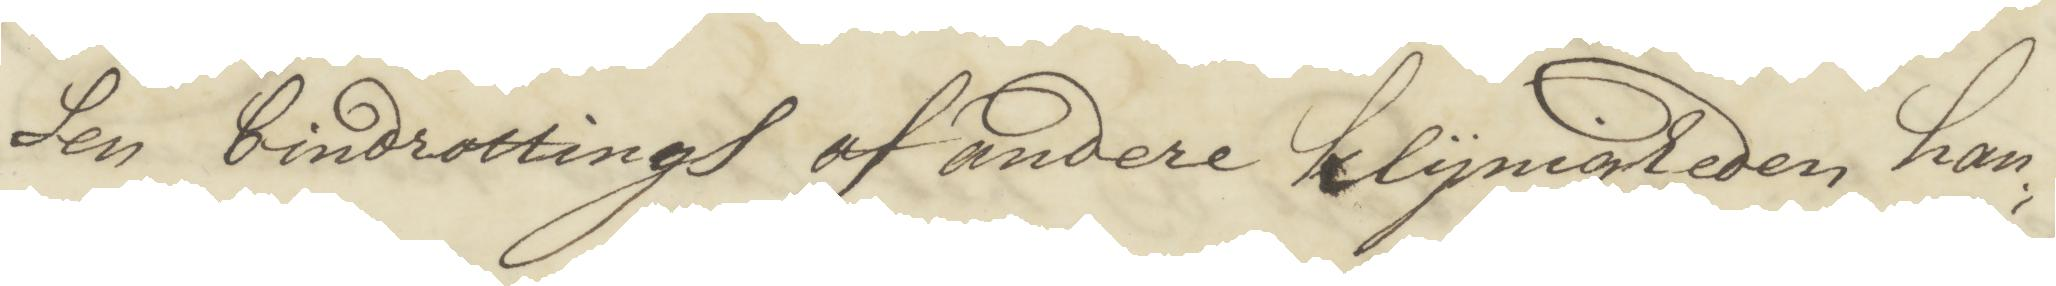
„sen bindrottings of andere klijnigheden han„
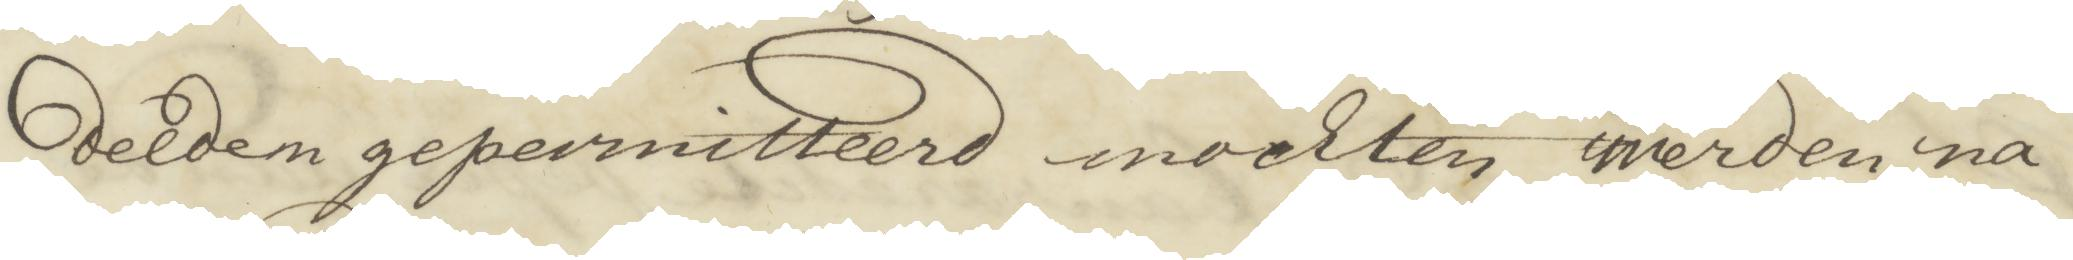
delden gepermitteerd mochten werden na
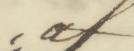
„af
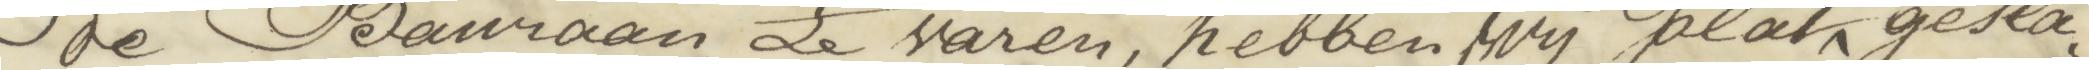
de Bauraan te varen, hebben wij plat ^ gesla=
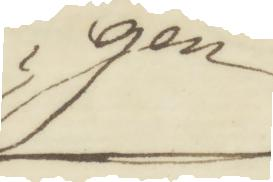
=gen
